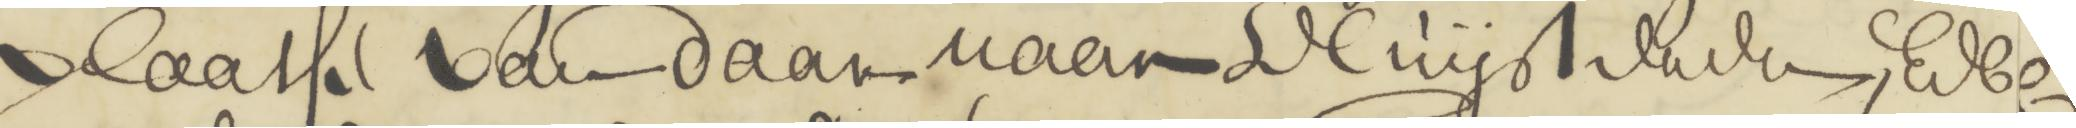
plaatse van daar naar teluijsteren, heb
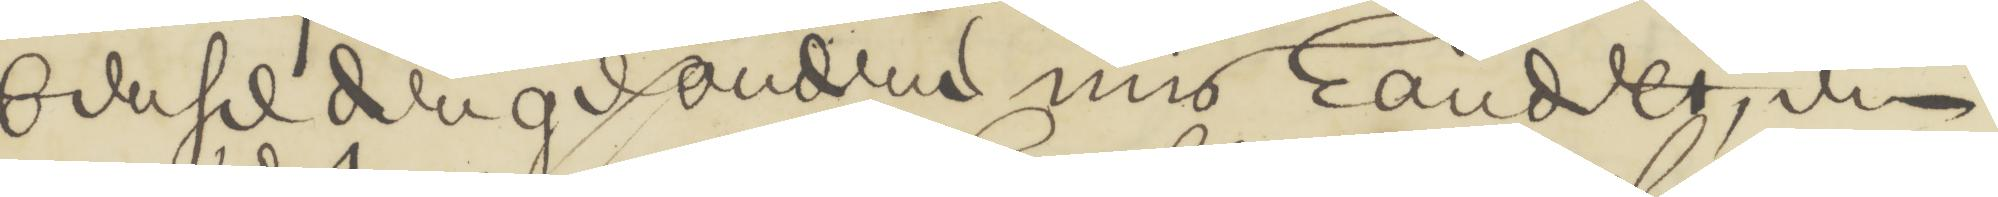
bense den gesondene mishandelt, en
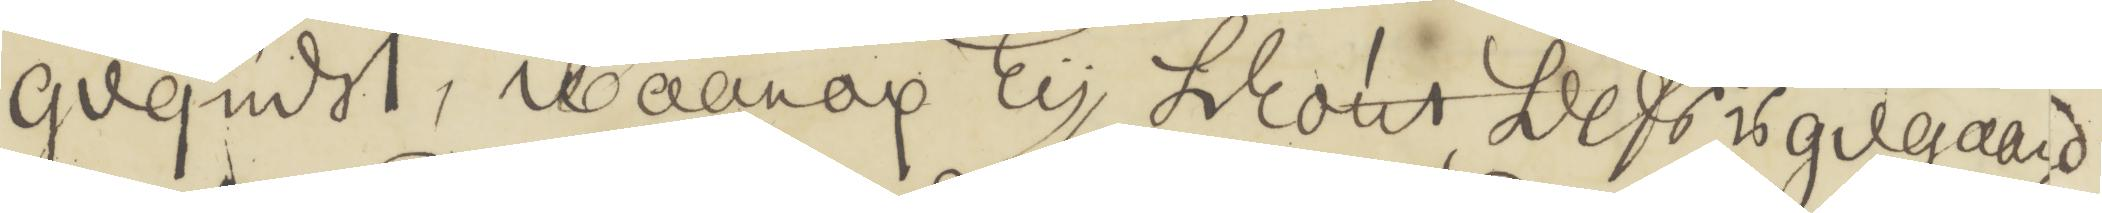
gequest, waarop hij schout selfs is gegaan
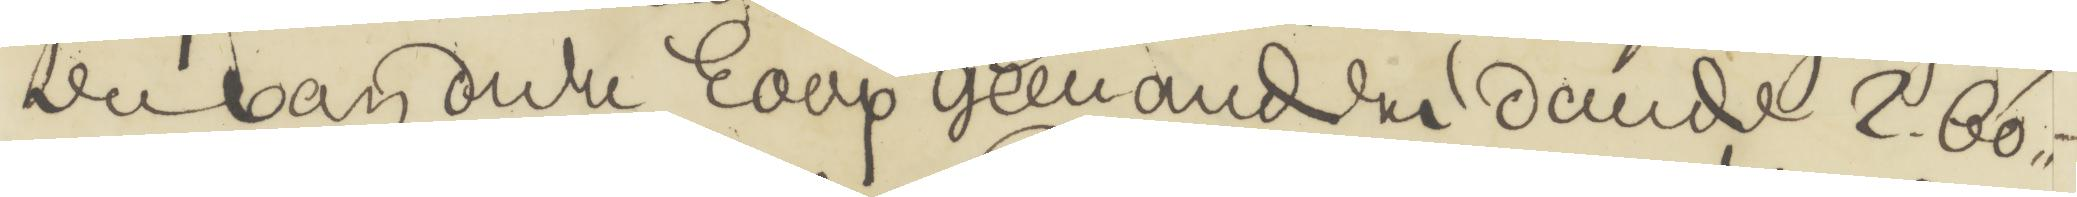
en van dien hoop geen andere dan de t.bo„
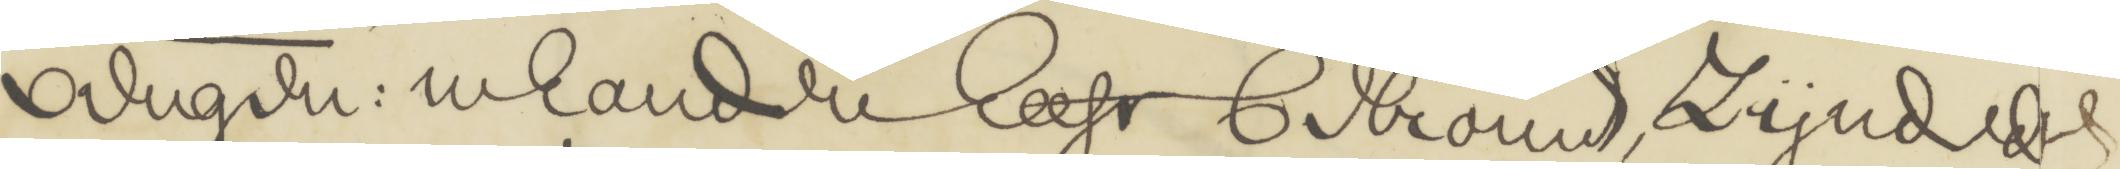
vengen: inhanden heeft bekomen, zijnde d
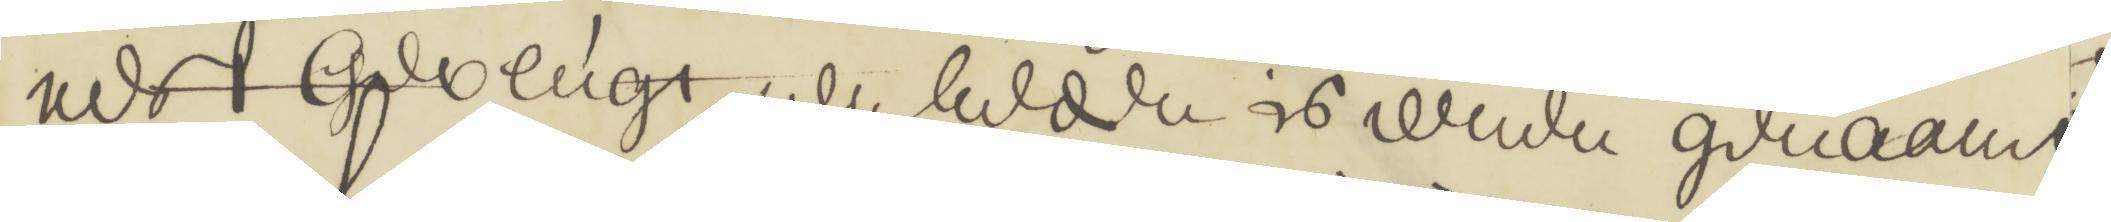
rest gevlugt, en heden is eenen genaamt
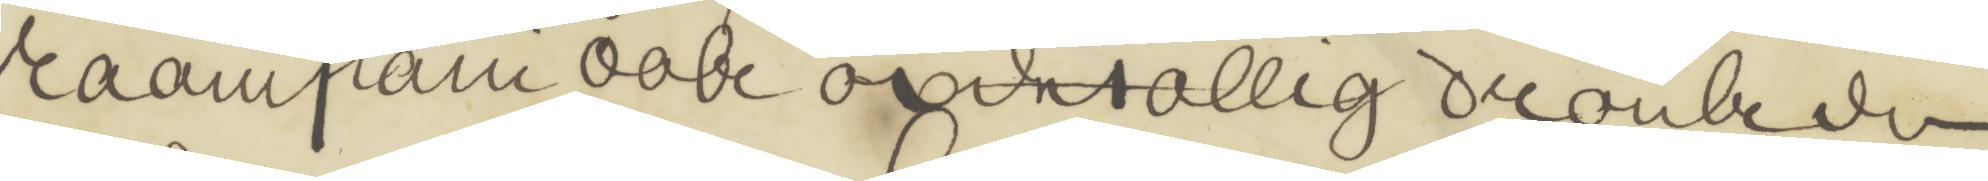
raamsiam ook overtollig dronken
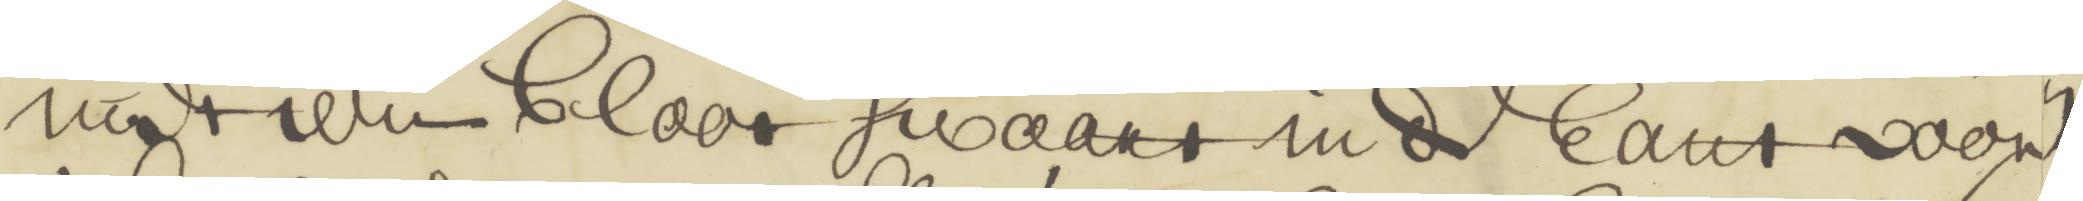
met een bloot swaart in de hant voor
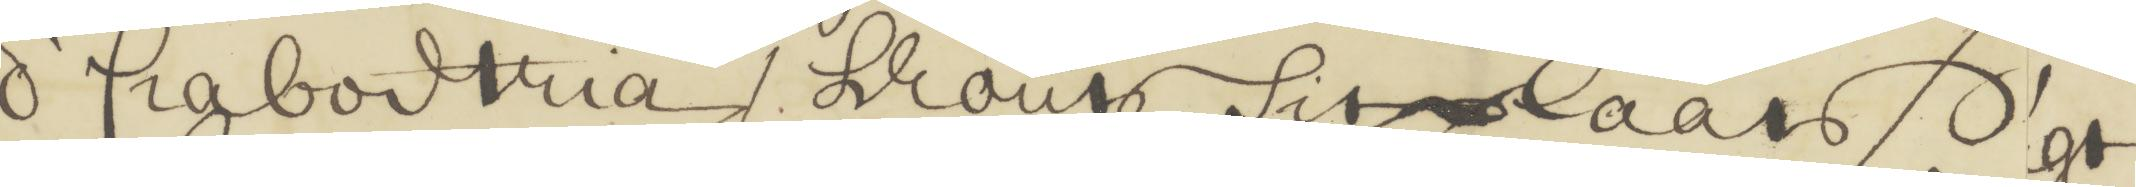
d'siaboetria/. schoutssitplaats/
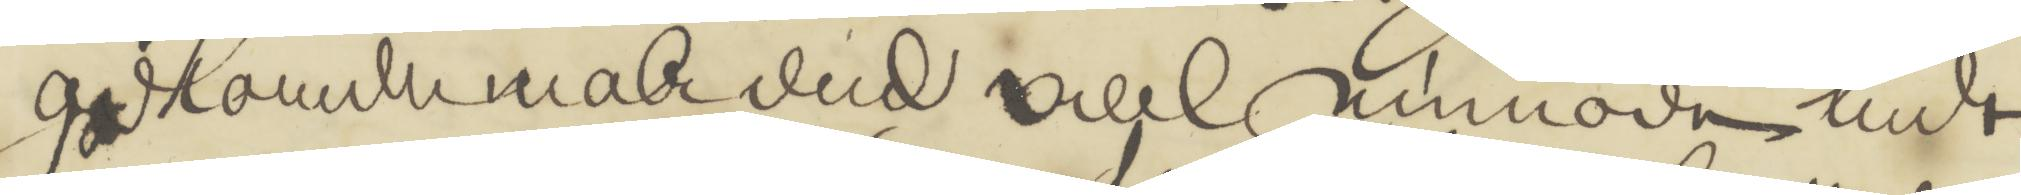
gekomen makende veel rumoer met
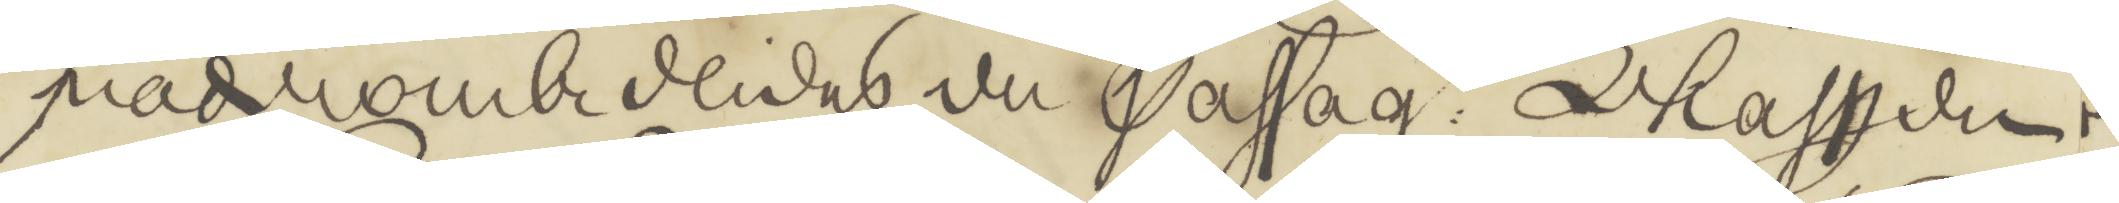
nade winkeliers en passag:s tekappen.
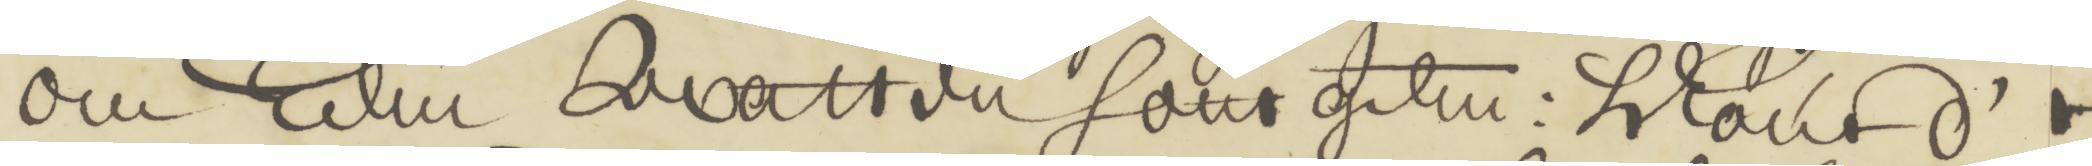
om hem tevatten sont gem: schout d’
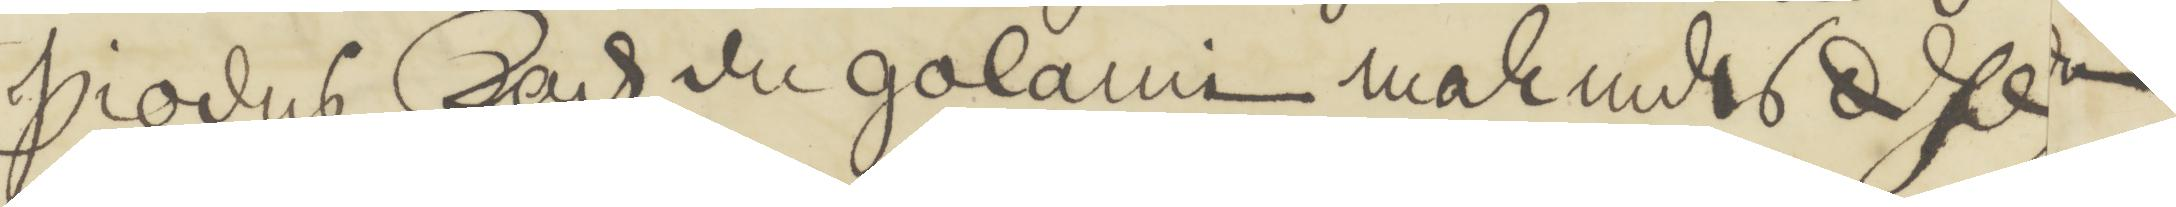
pioens daen en golami mahmets dese
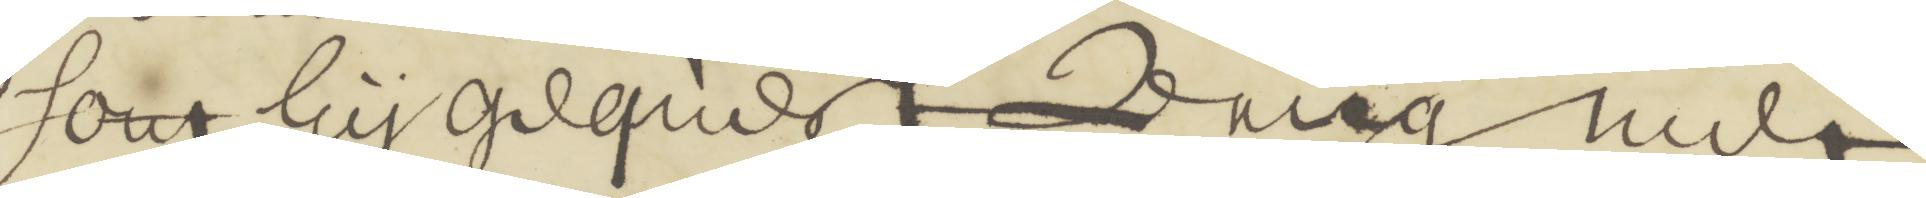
sont hij gequest terug met
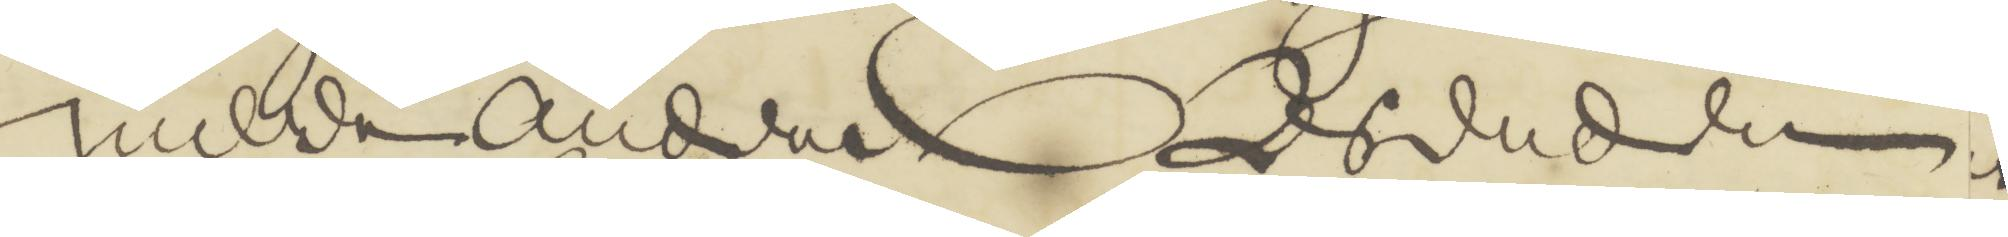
meer andere tesenden
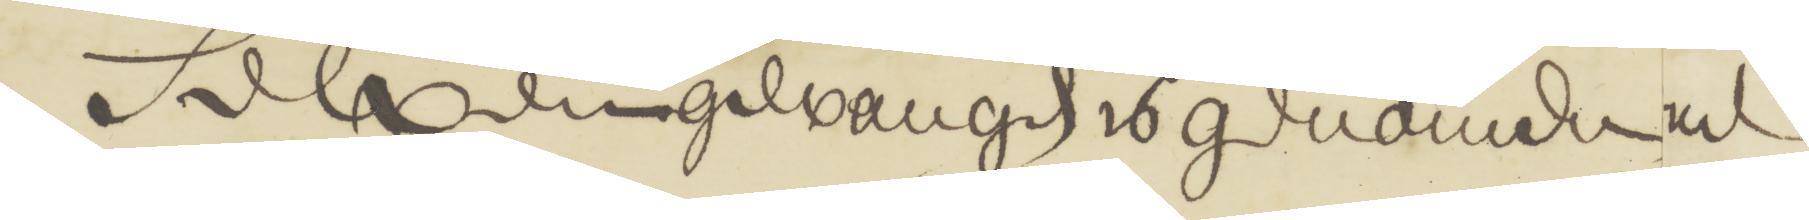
den selven gevangen is genomen
